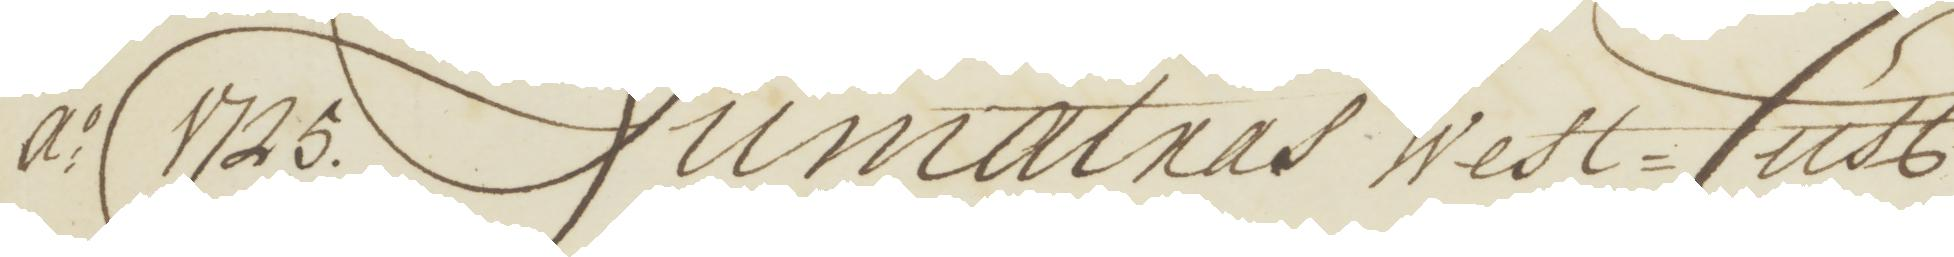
a:o 1725. Sumatras West=Cust
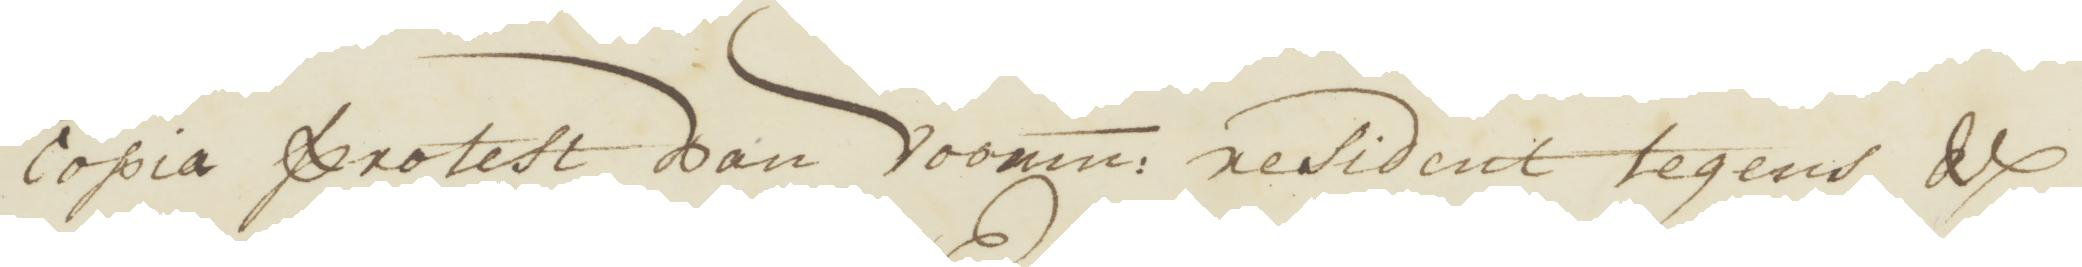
Copia protest van voorm: resident tegens de
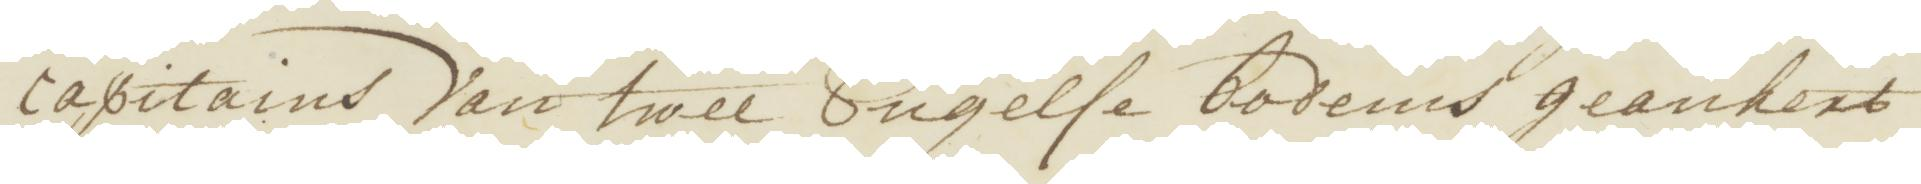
capitains van twee Engelse bodems geankert
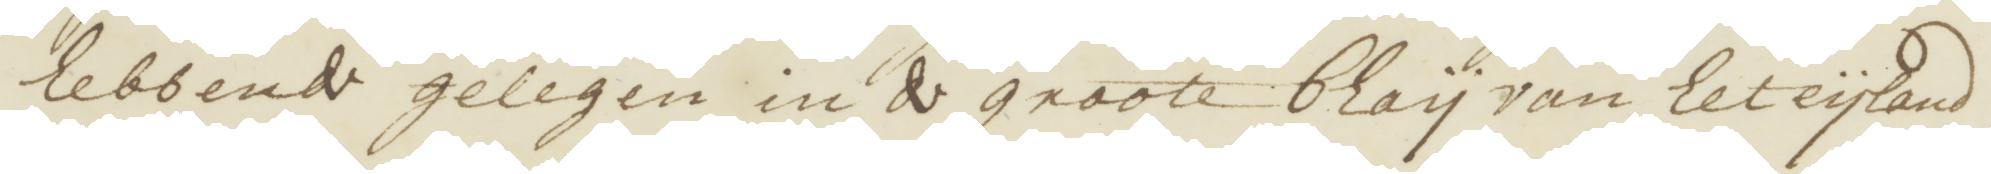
hebbende gelegen in de groote bhaij van het eijland
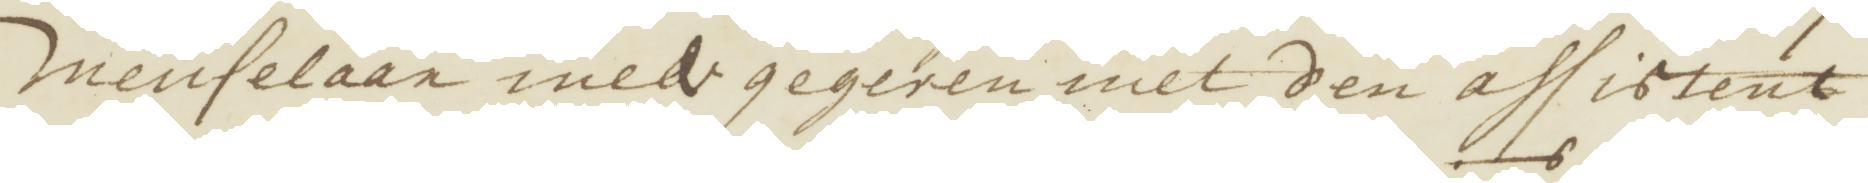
meuselaar mede gegeven met den assistent
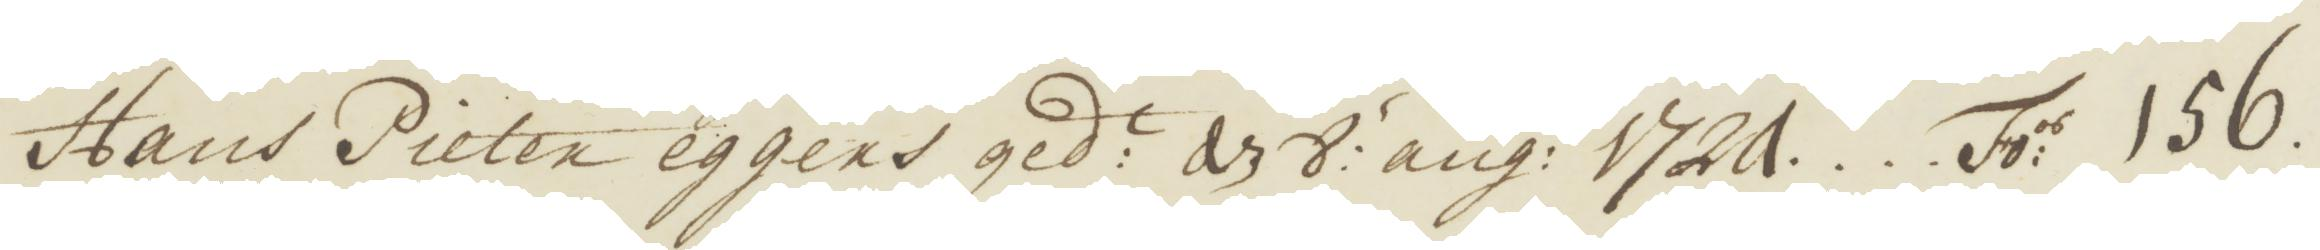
Hans Pieter eggers ged:t den 8:' aug:s 1724.... Fo:os 156.
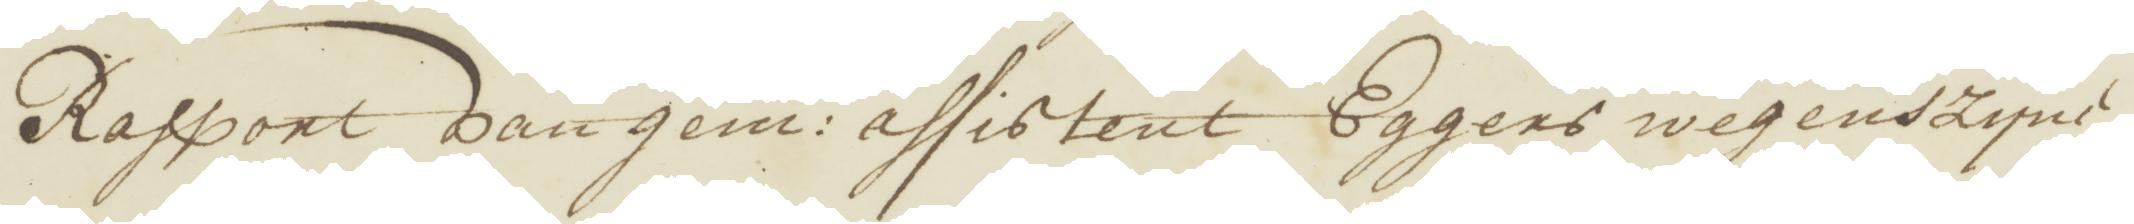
Rapport van gem: assistent Eggers wegens zijne
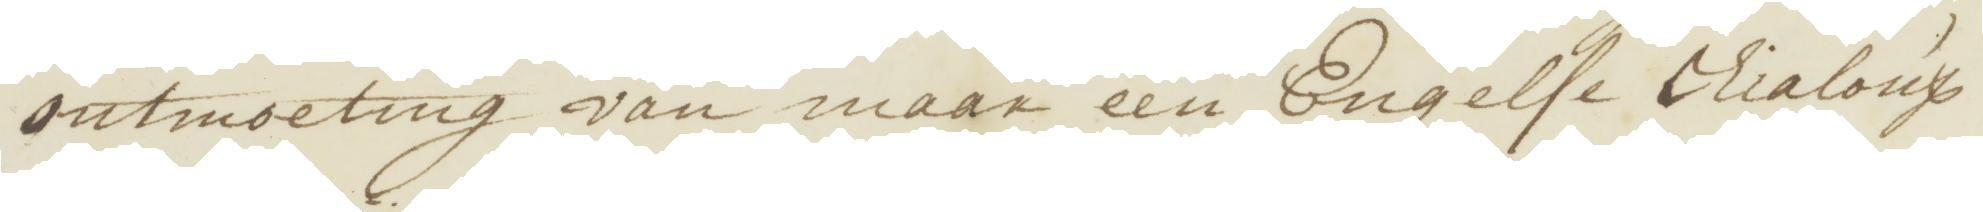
ontmoeting van maar een Engelse Chialoup
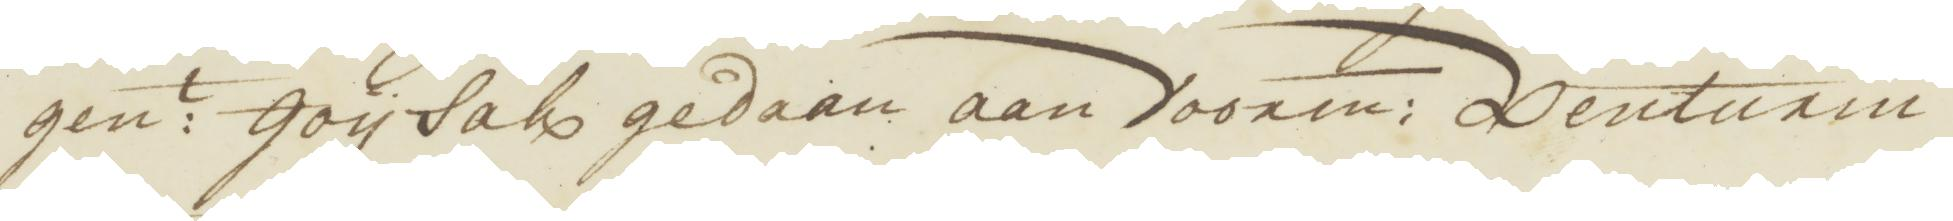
gen:t goijsak gedaan aan voorm: Venturin
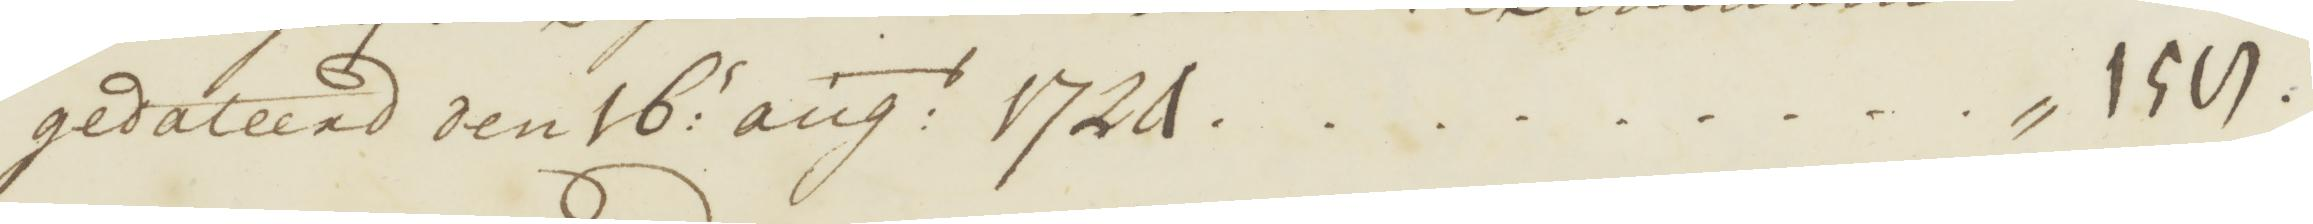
gedateerd den 16:' aug:s 1724. . . . . . . . . „ 158.
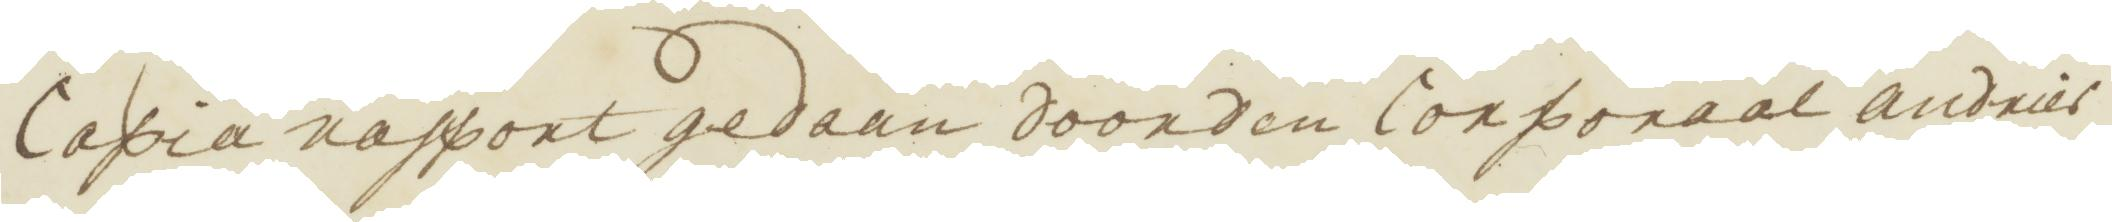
Copia rapport gedaan door den Corporaal andries
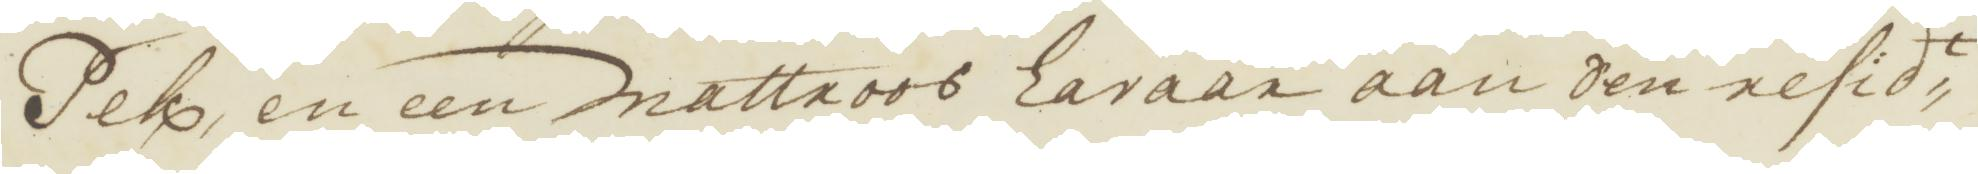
Pek, en een mattroos havaar aan den resid„t
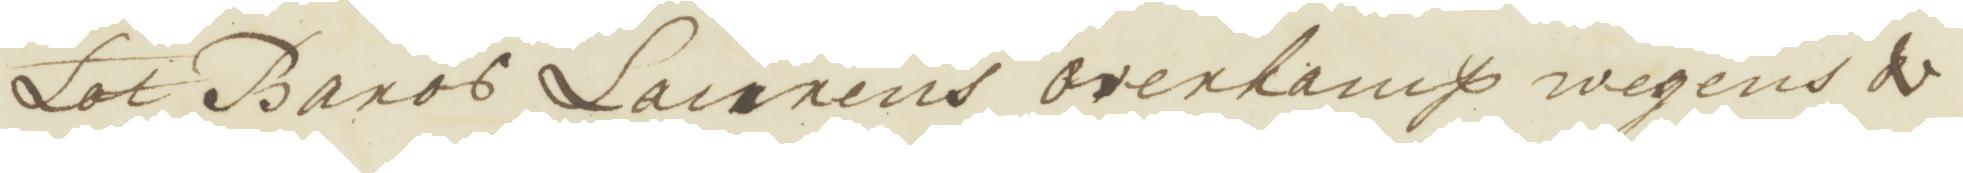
tot Baros Laurens overkamp wegens de
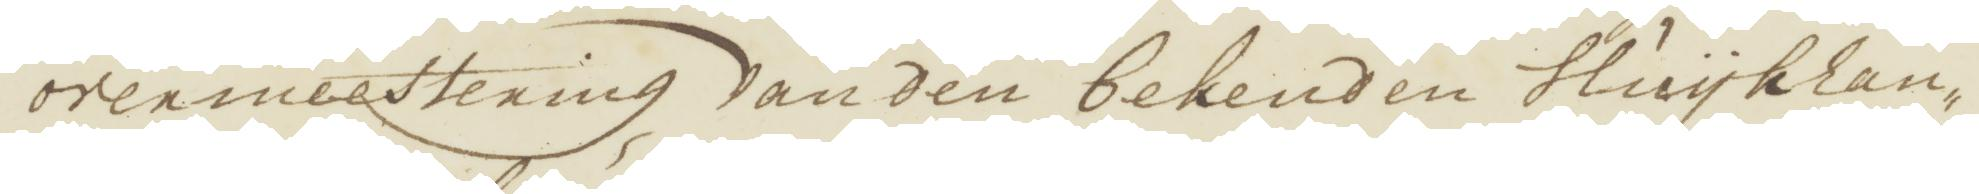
overmeestering van den bekenden sluijkhan„
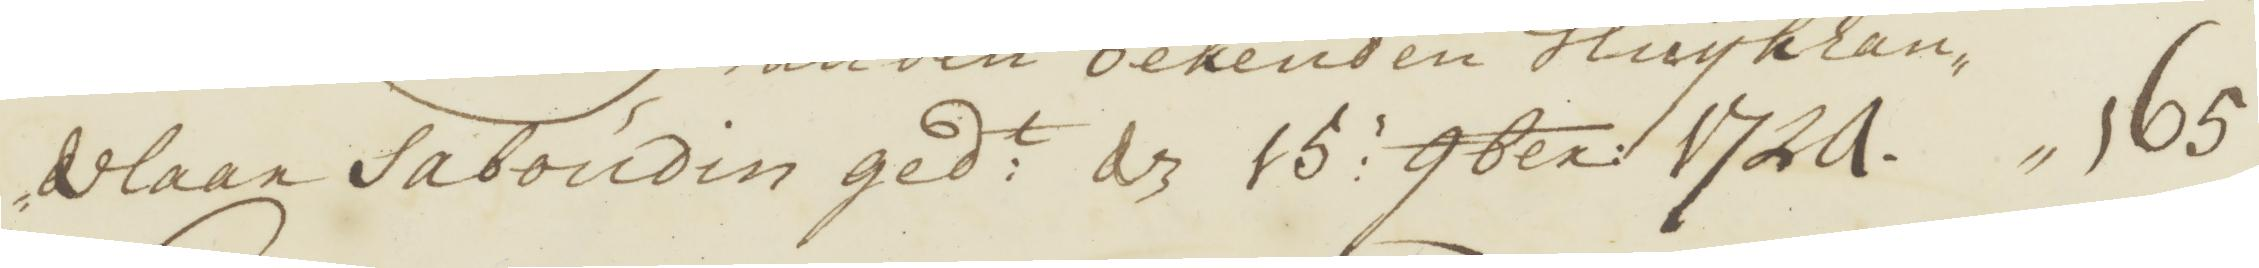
delaar saboudin ged:t den 15:' 9ber: 1724. „165
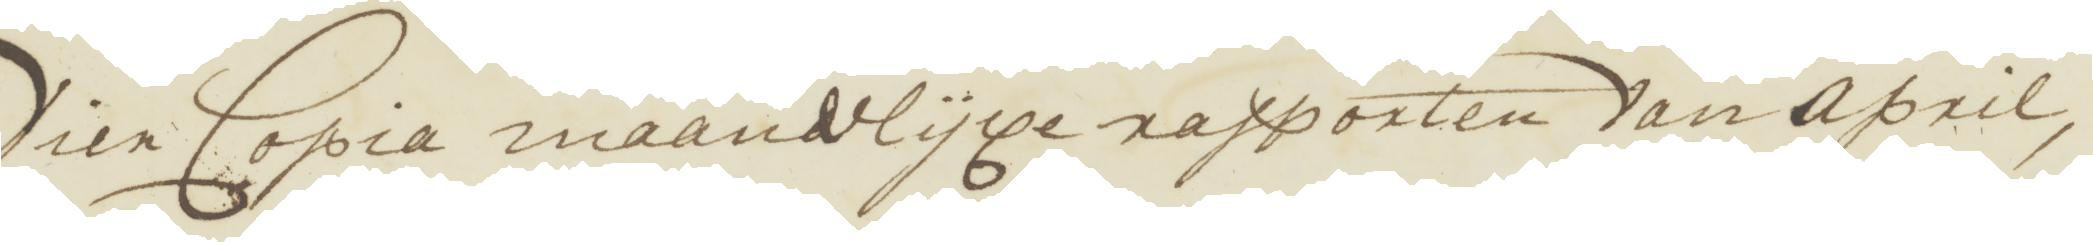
Vier Copia maandelijxe rapporten van april,
